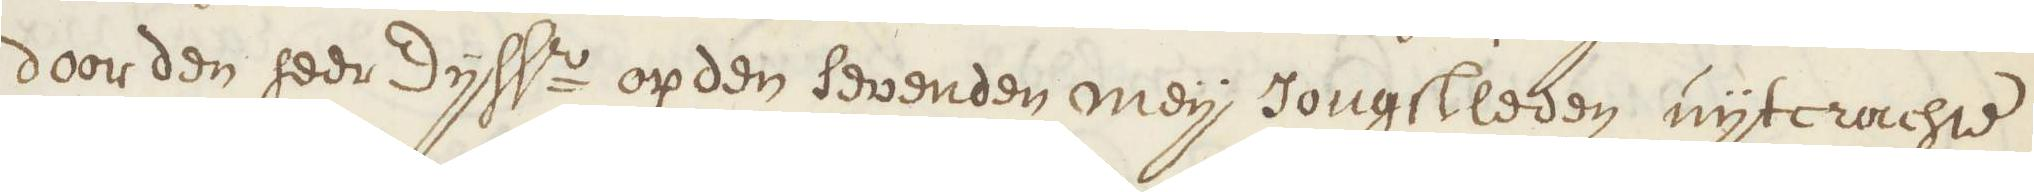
door den heer Eijss=r op den sevenden meij Iongstleden uijtcrachte
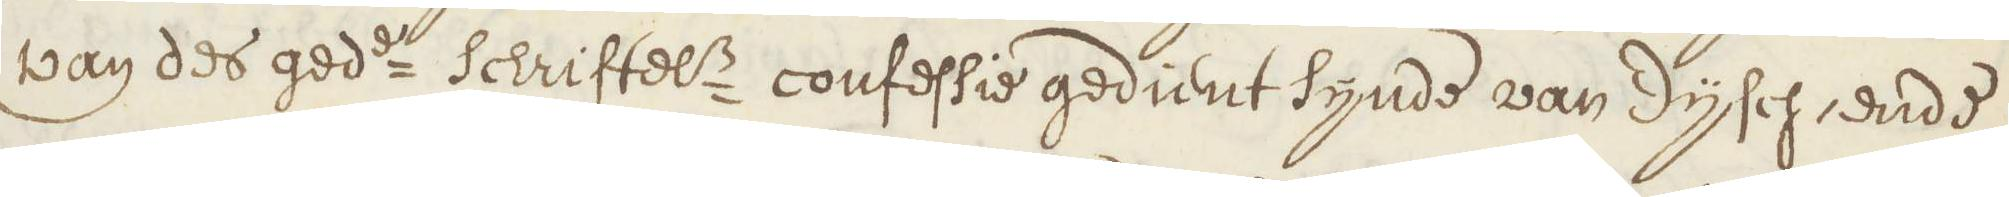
van des ged=e schrifteljk confessie gedient sijnde van Eijsch, ende
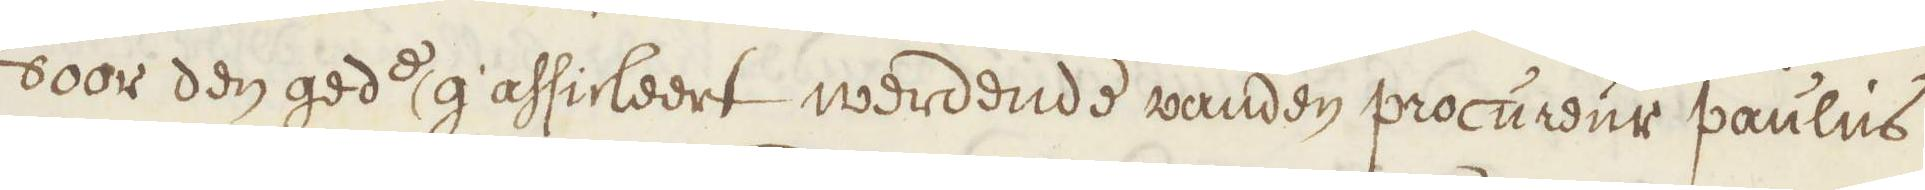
door den gede (g’assisteert werdende vanden procureur paulus
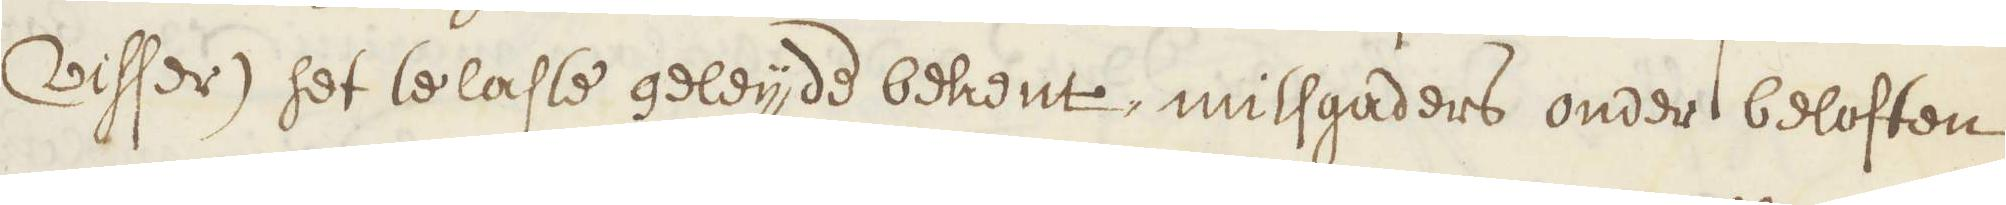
visser) het te laste geleijde bekent, mitsgaders onder beloften
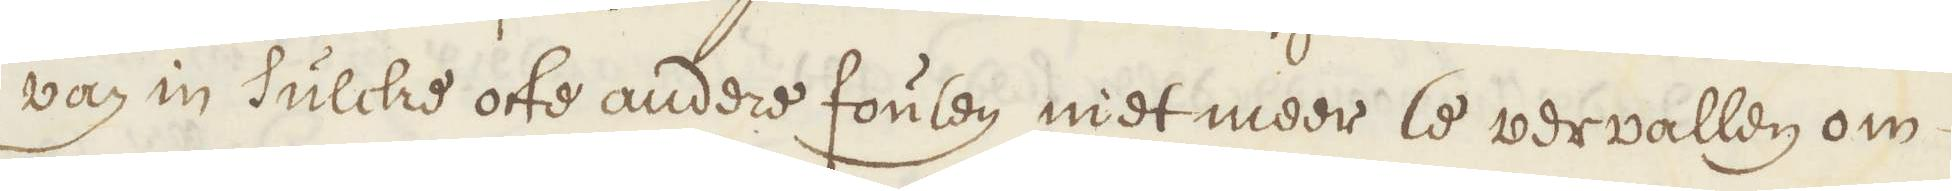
van in sulcke offe andere fouten niet meer te vervallen om
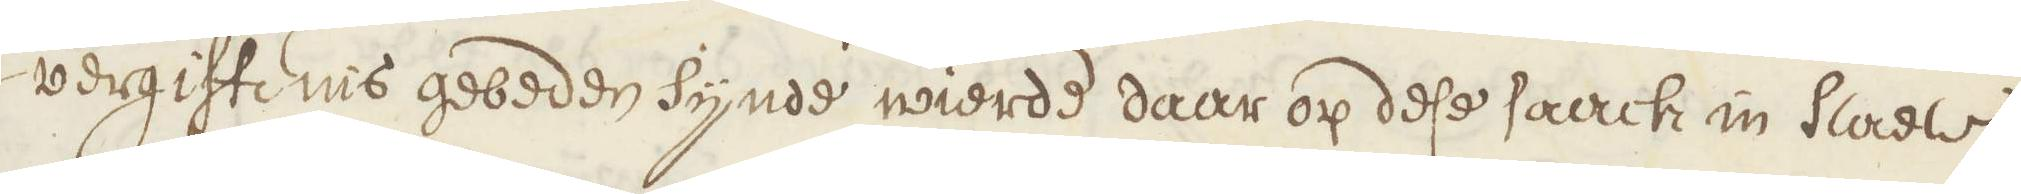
vergiffenis gebeden sijnde wierde daar op dese saeck in staete
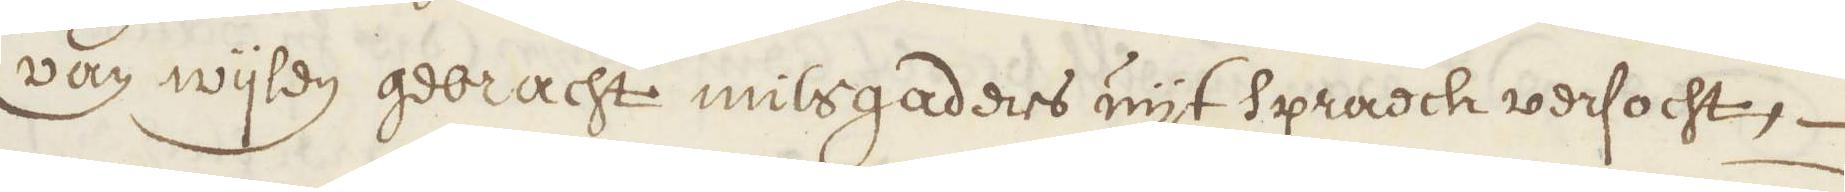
van wijsen gebracht mitsgaders uijt spraeck versocht, —
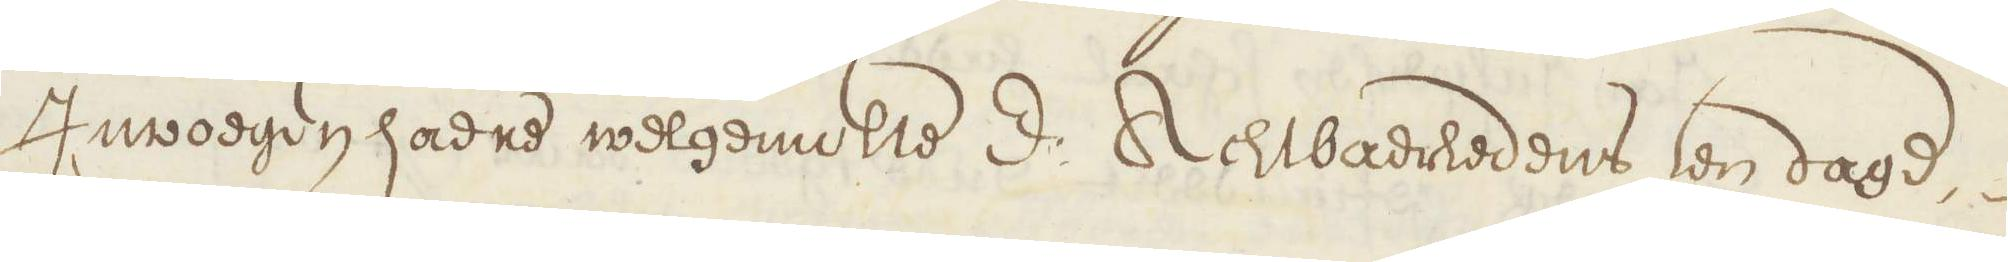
Jnvoegen haere welgemelte E: Achtbaerhedens ten dage,
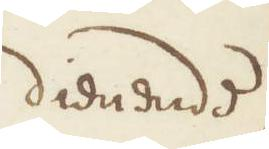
dienende
